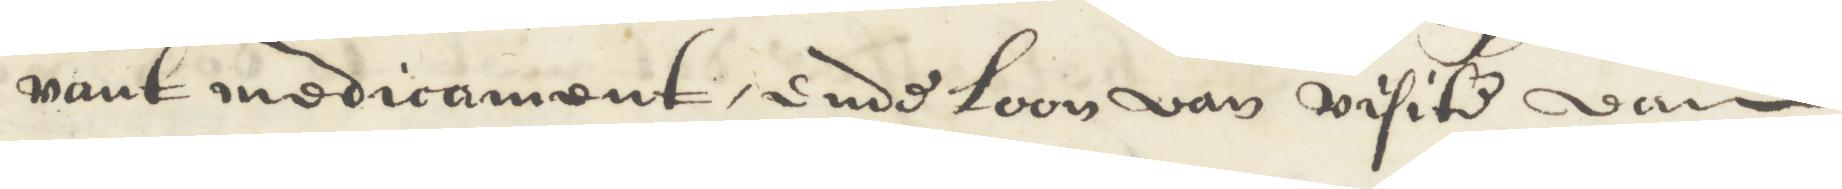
vant medicament, Ende loon van visite van
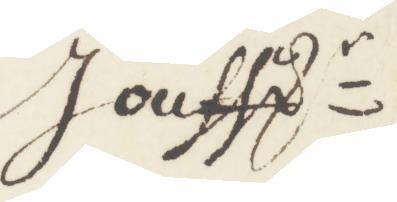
Jouffv=r
